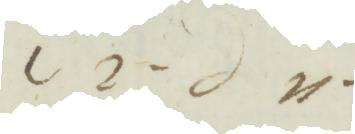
i u d n:.
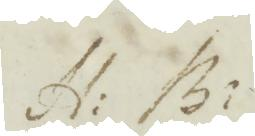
H: B:
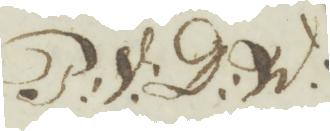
P:V: D:W:
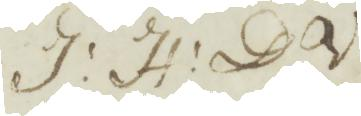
J: J: D V
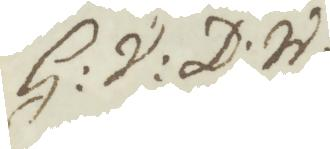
G: V:D:W.
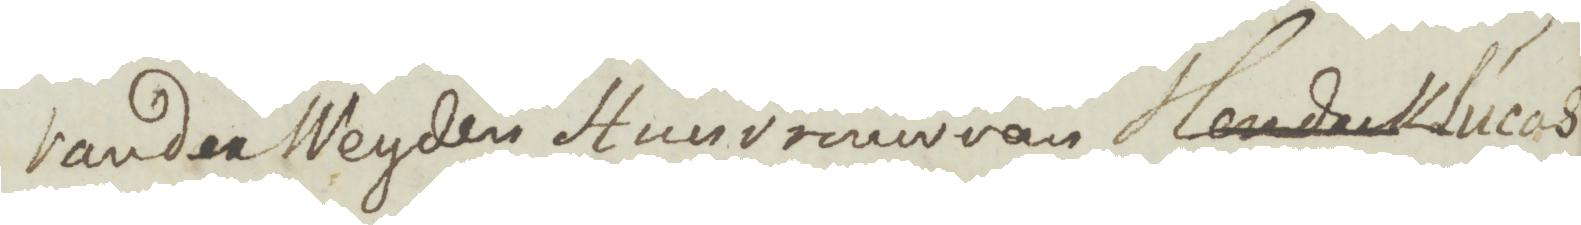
van der Weyden Huisvrouw van Hendrik Lucas
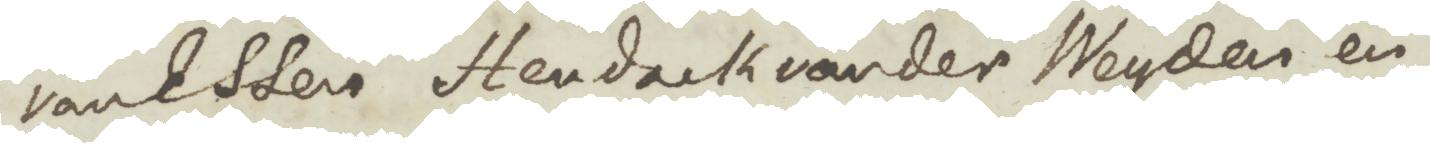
van Essen Hendrik vander Weyden en
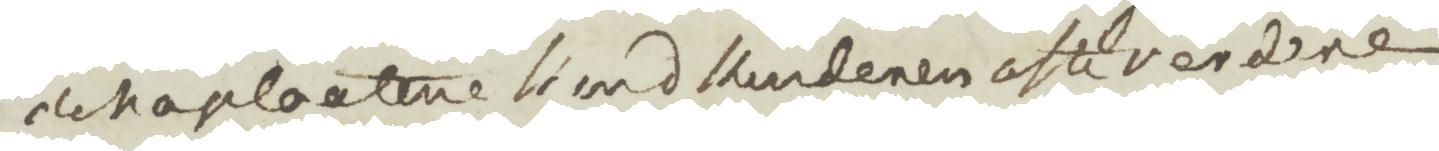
de nagelaatene kind kinderen of te verdere
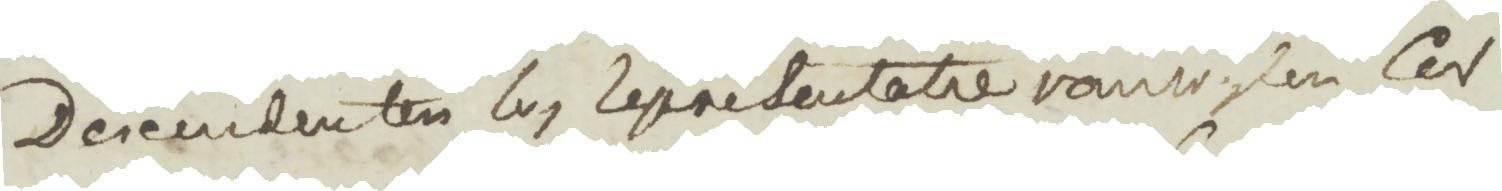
Descendenten by representatie van wylen Cor
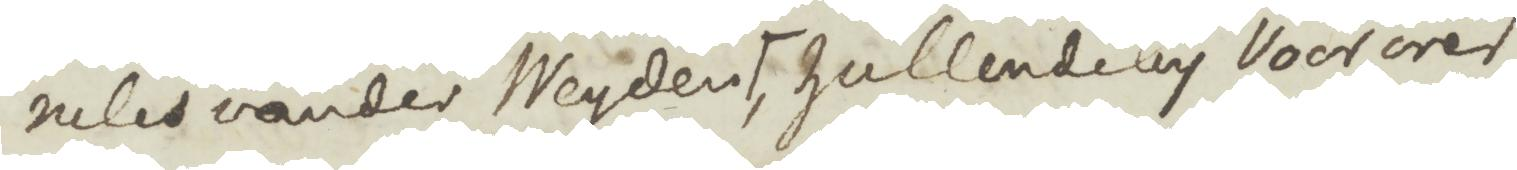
nelis vander Weyden ^, zullende by voor over
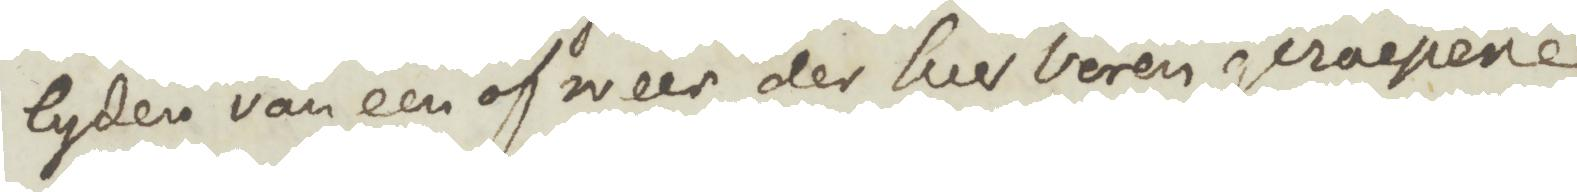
lyden van een of meer der hier voren geroepene
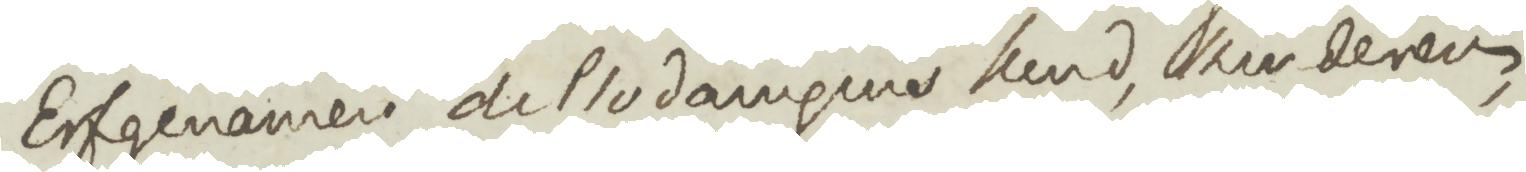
Erfgenamen des sodanigens kind, kinderen,
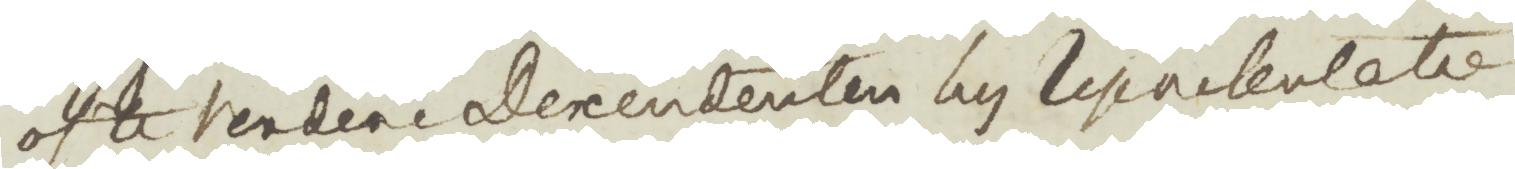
ofte verdere Decendenten by representatie
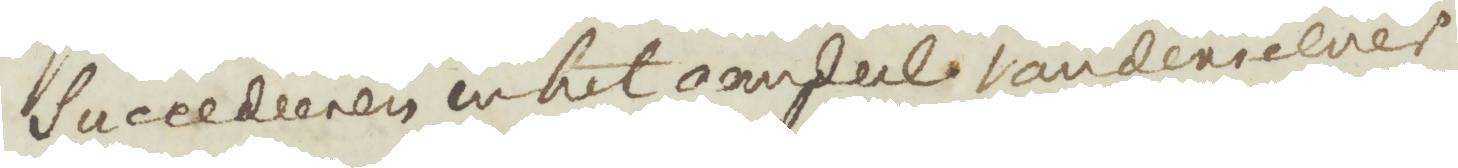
succedeeren in het oordeel van derselves
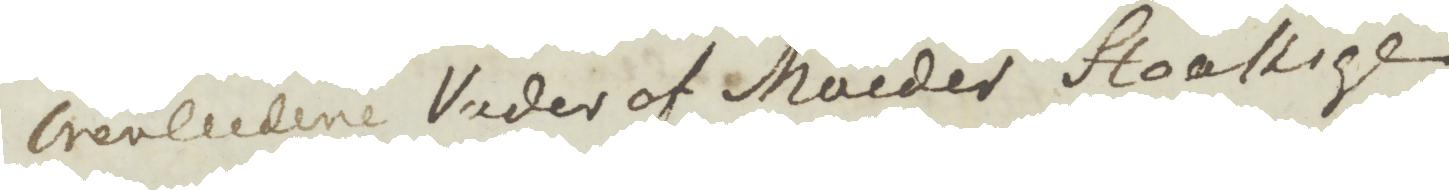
overleedene Vader of Moeder staakige
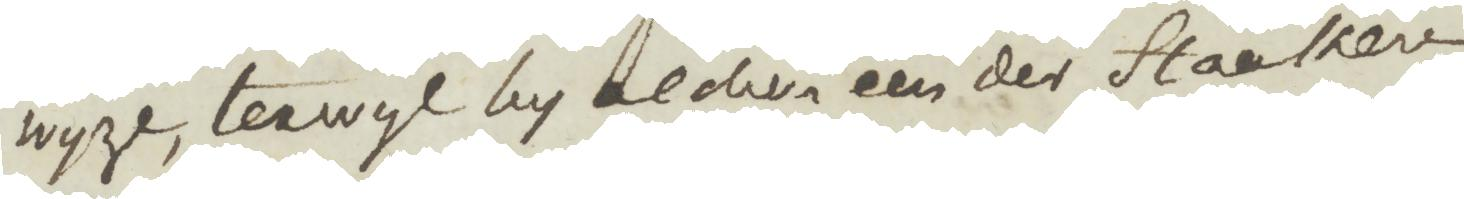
wyze, terwyl by aldien een der staaken
